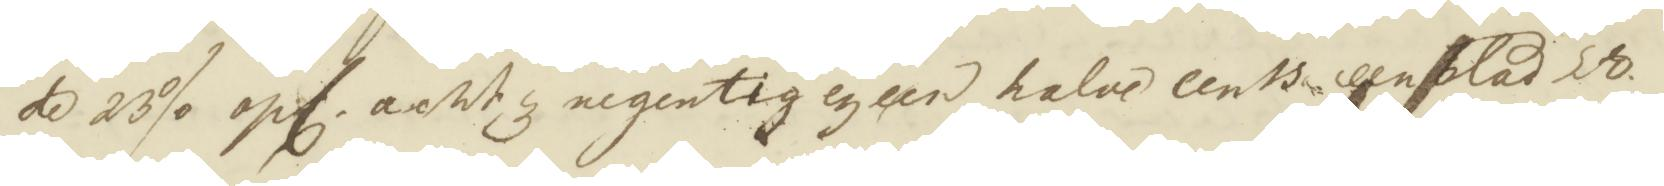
de 23 % opC. acht en negentig en een halve een cents blad 510.
